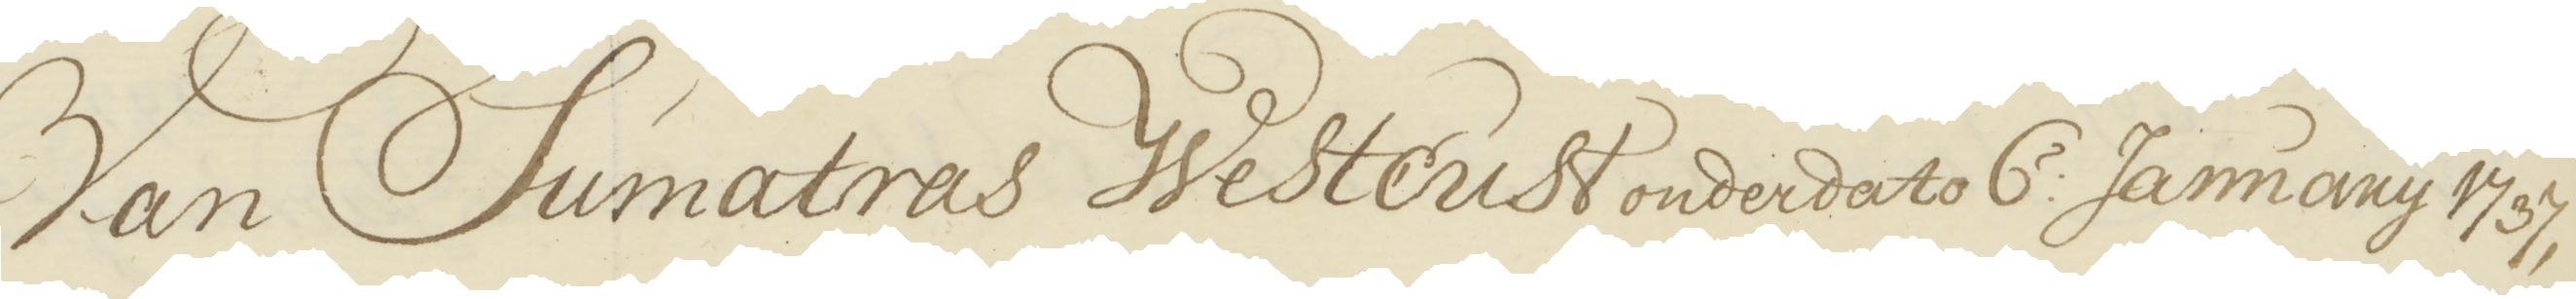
Van Sumatras Westcust onderdato 6:' Januarij 1737,
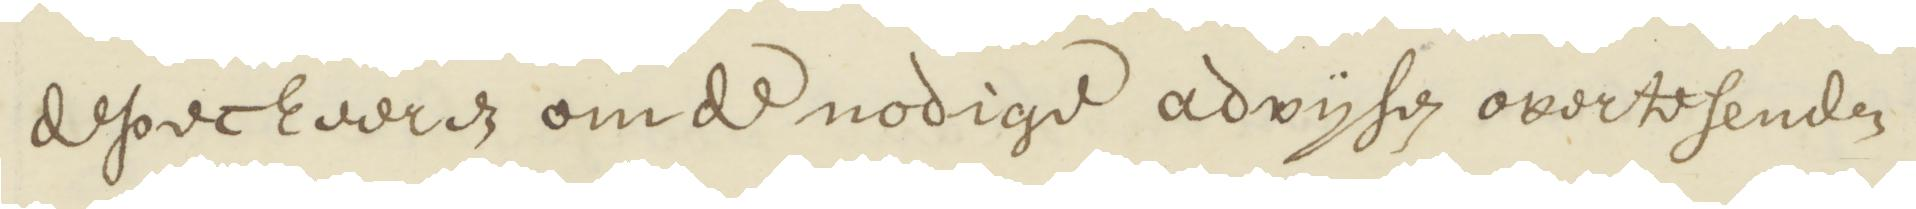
depecheeren om de nodige advijsen overtesenden
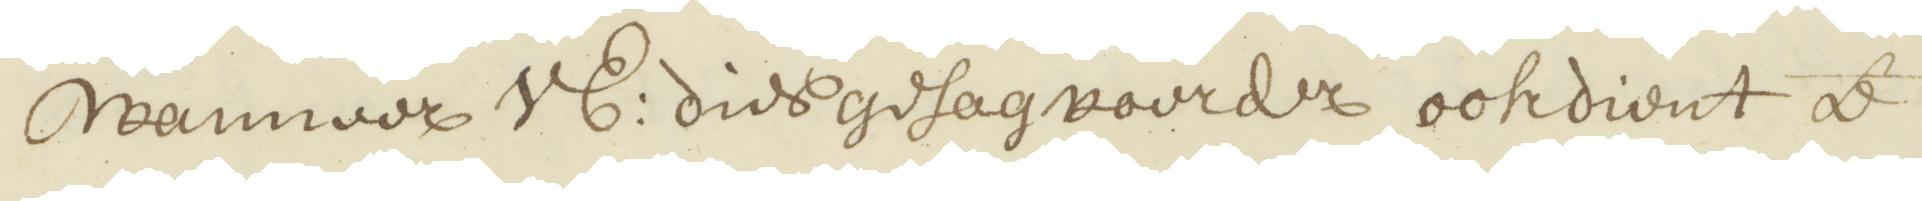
wanneer UE: dies gesagvoerder ook dient te
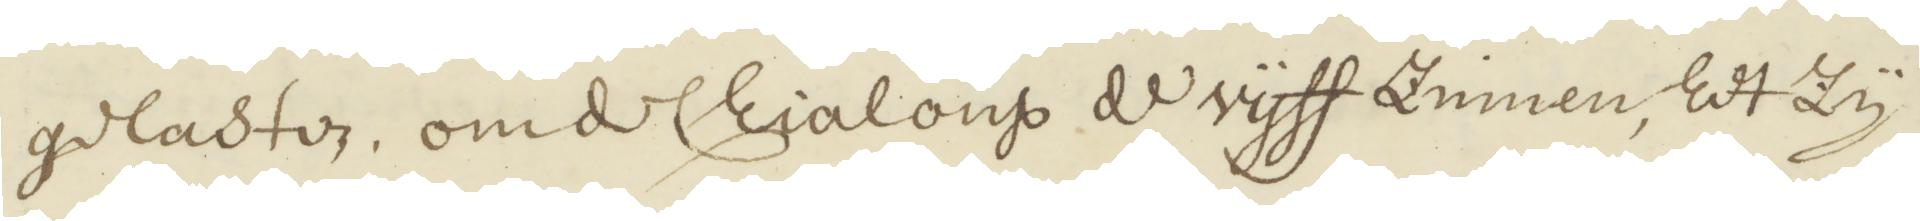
gelasten, om de Chialoup de vijff zinnen, het zij
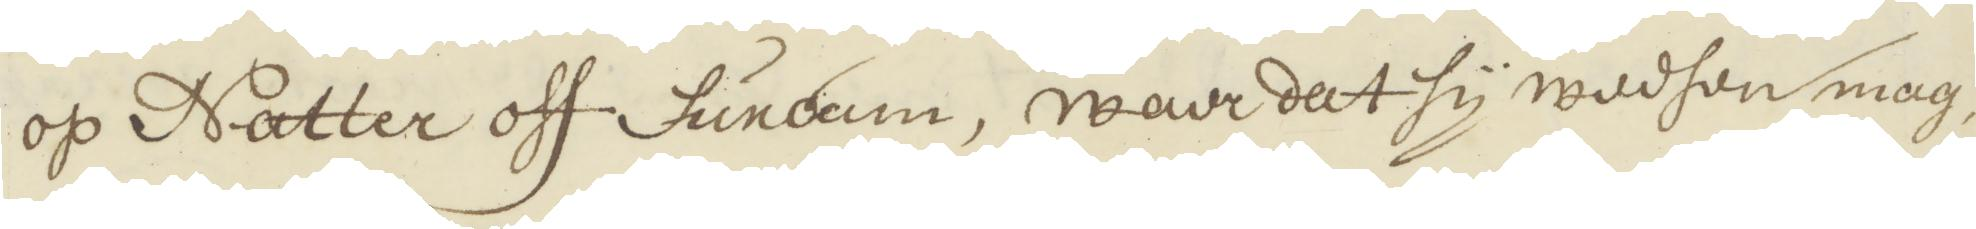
op Natter off surcam, waer dat sij weesen mag,
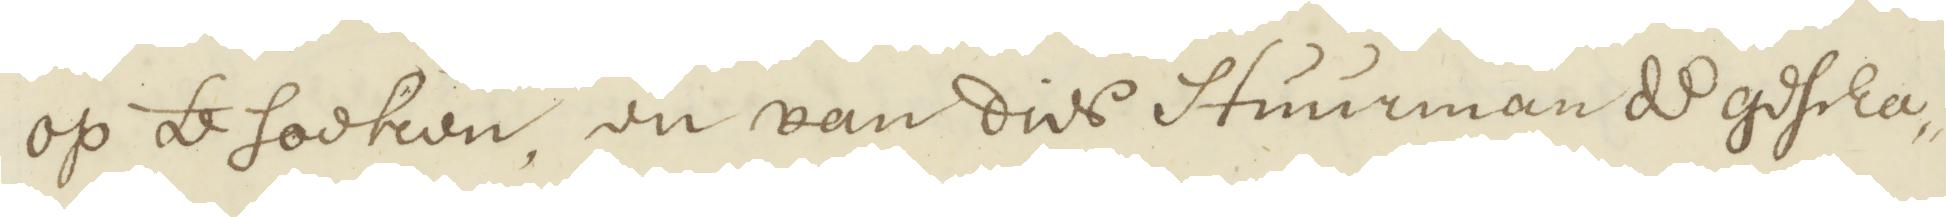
op te soeken, en van dies stuurman de gescha„
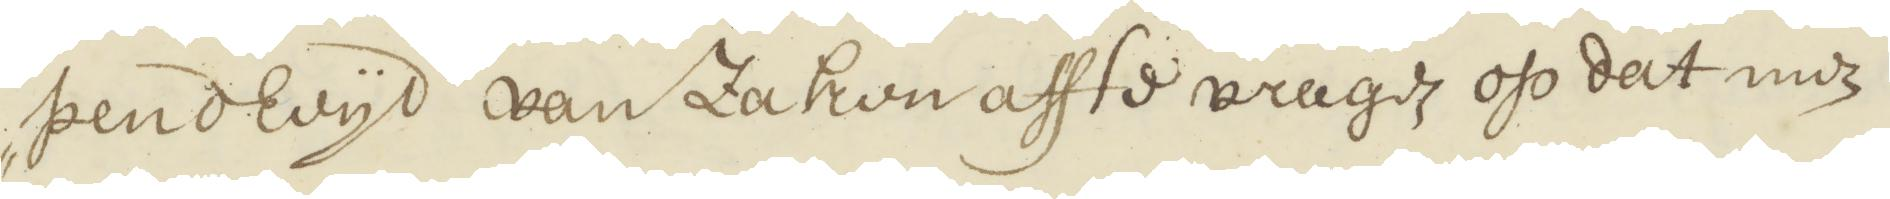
„pendheijd van Zaken affte vregen op dat men
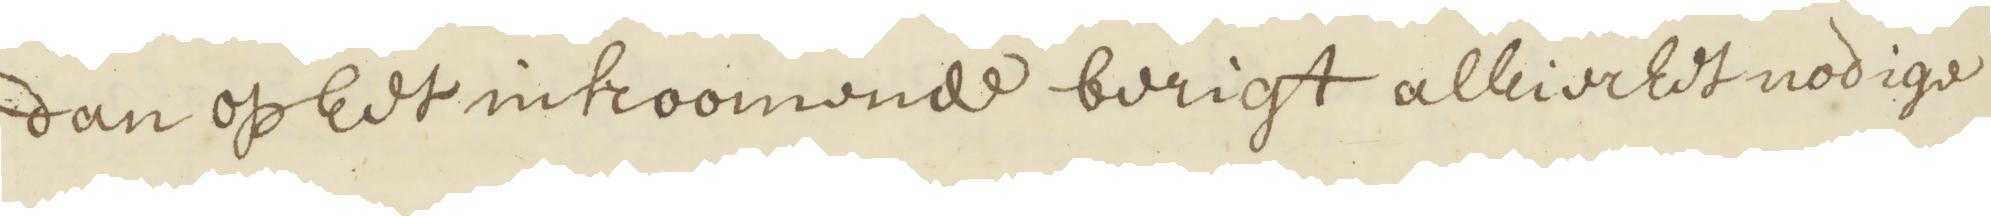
dan op het inkoomende berigt alhier het nodige
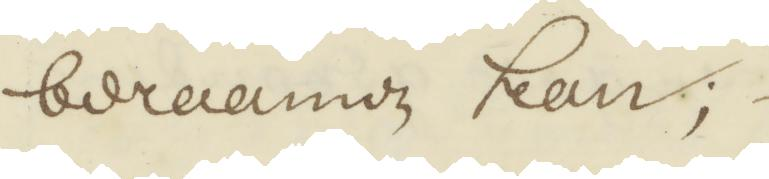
beraamen kan; — .
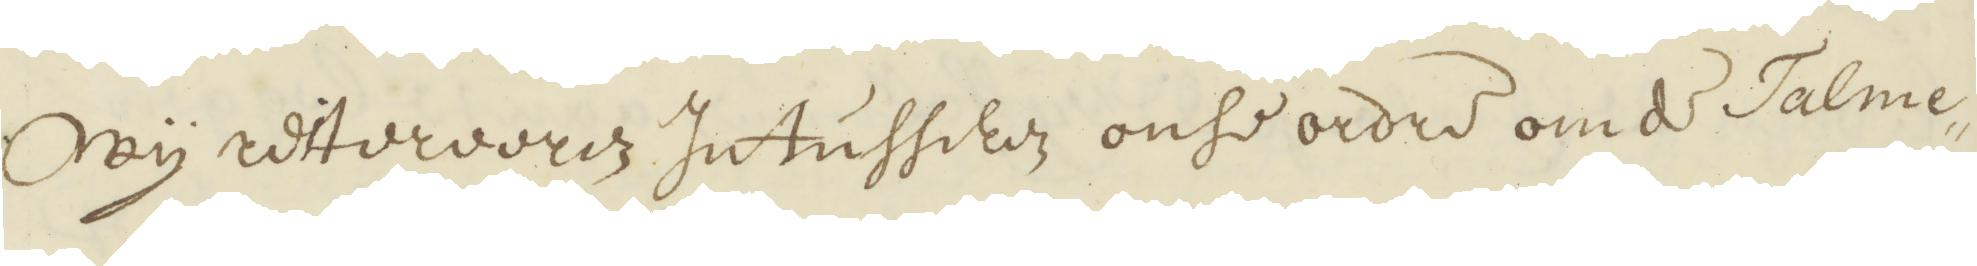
wij restereeren Jntusschen onse ordre om de Talme„
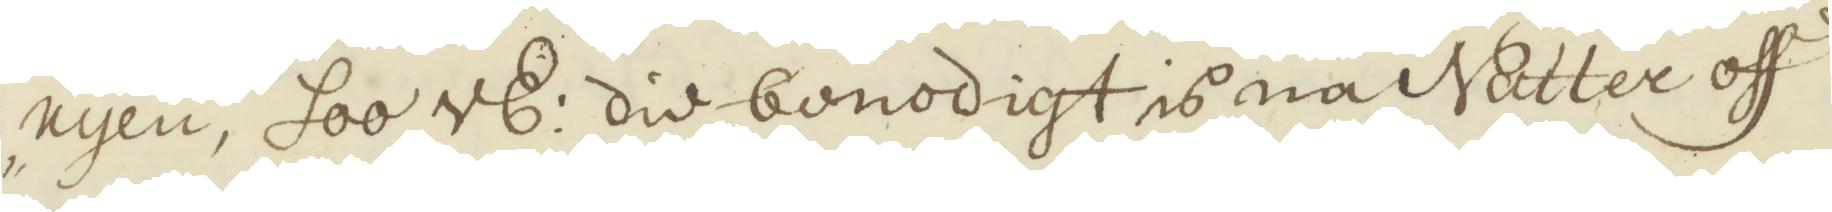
„rijen, soo UE: die benodigt is na Natter off
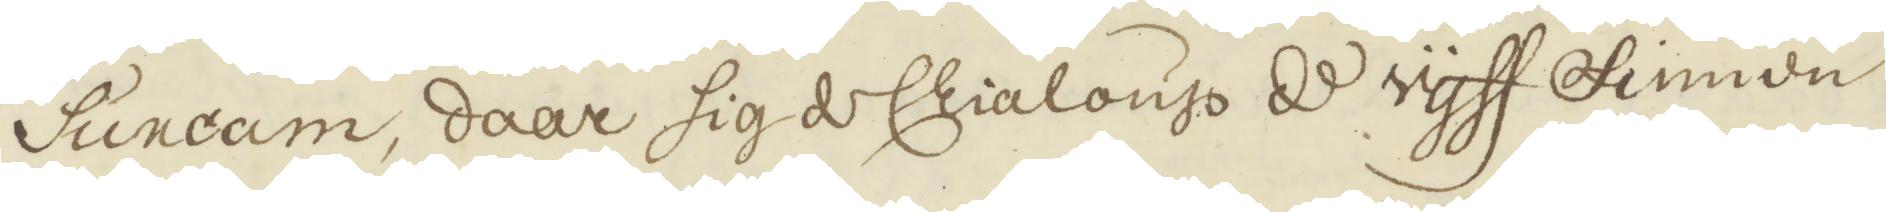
surcam, daar sig de Chialoup de vijff Sinnen
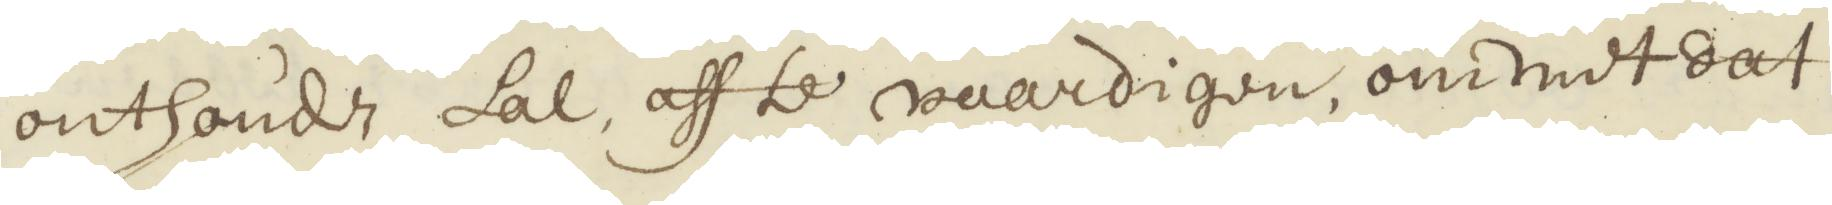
onthouden sal, aff te vaardigen, om met dat
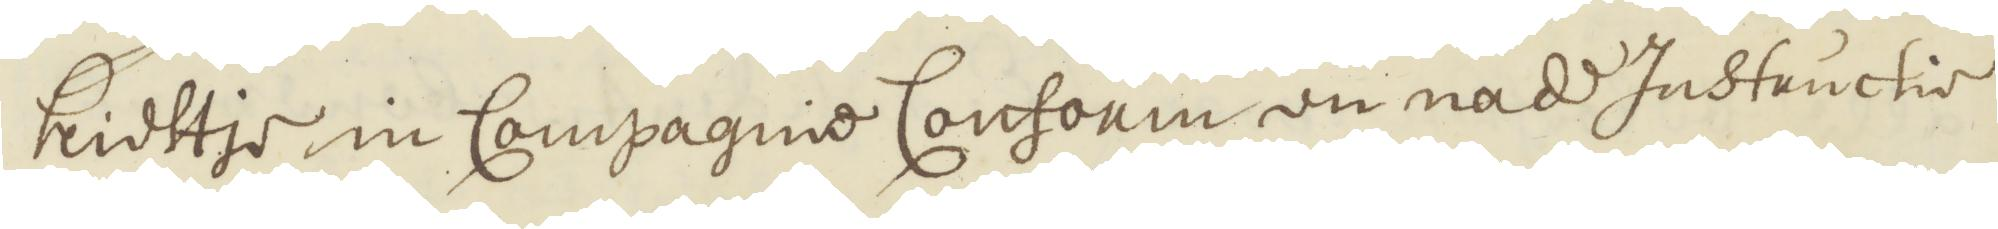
kieltje in Compagnie Conform en nade Jnstructie
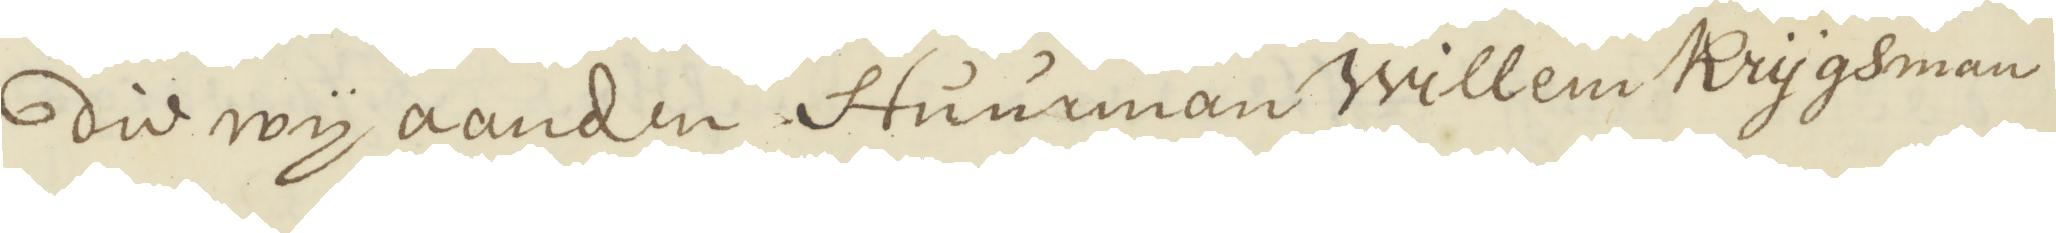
die wij aanden stuurman Willem Krijgsman
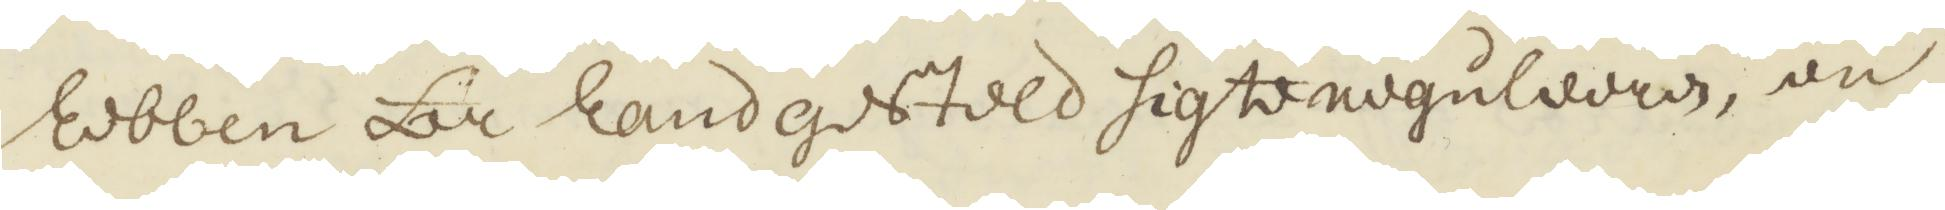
hebben ter hand gesteld sig te reguleeren; en
